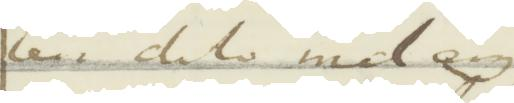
Een dito met enz
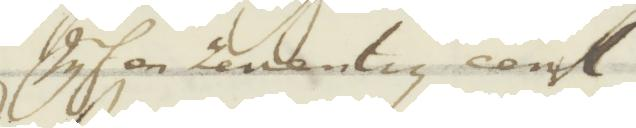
vyf en zeventig cent
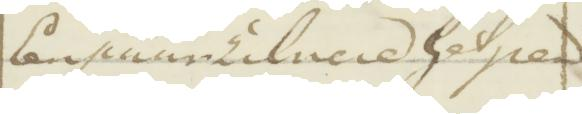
Een paar zilvere Gespen
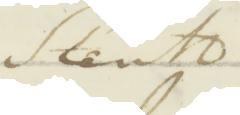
Stento
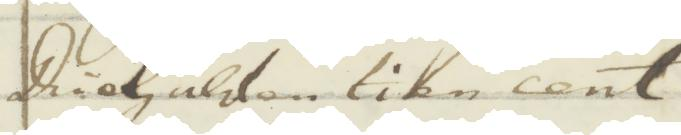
Drie Gulden tien Cent
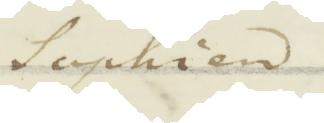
Saphier
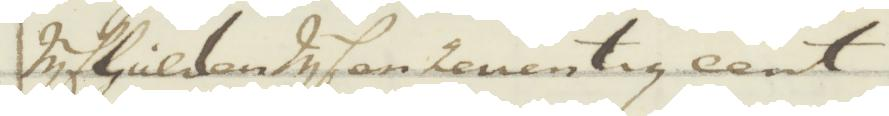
vyf Gulden vyf en zeventig cent
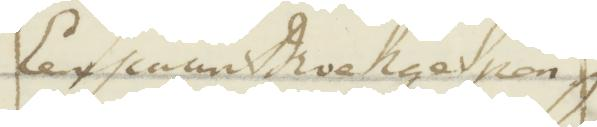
Een paar Broekgespen
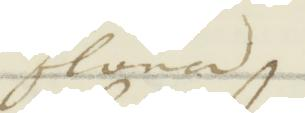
flora
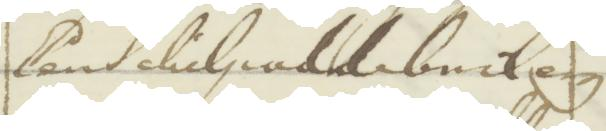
Een schilpaddebril enz
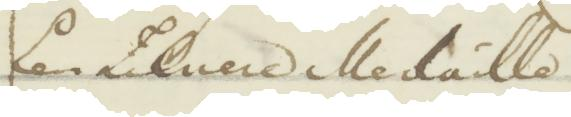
Een zilvere Medaille
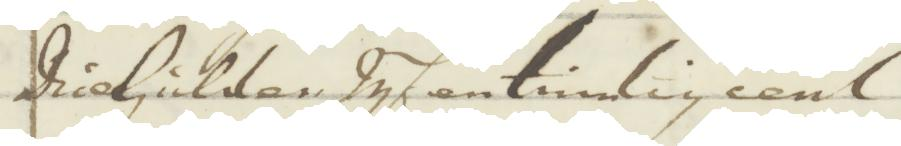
Drie Gulden vyf en twintig cent
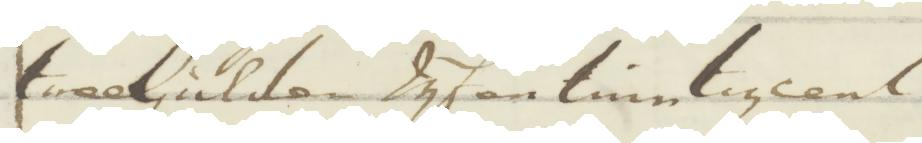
twee Gulden vyf en twintig cent
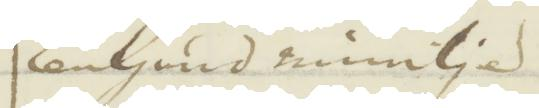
Een Goud muntje
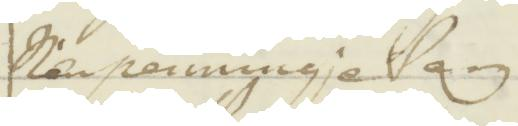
Vier penningjes enz
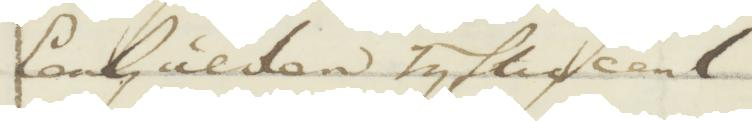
Een Gulden vyftig cent
